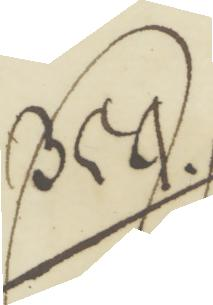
354.
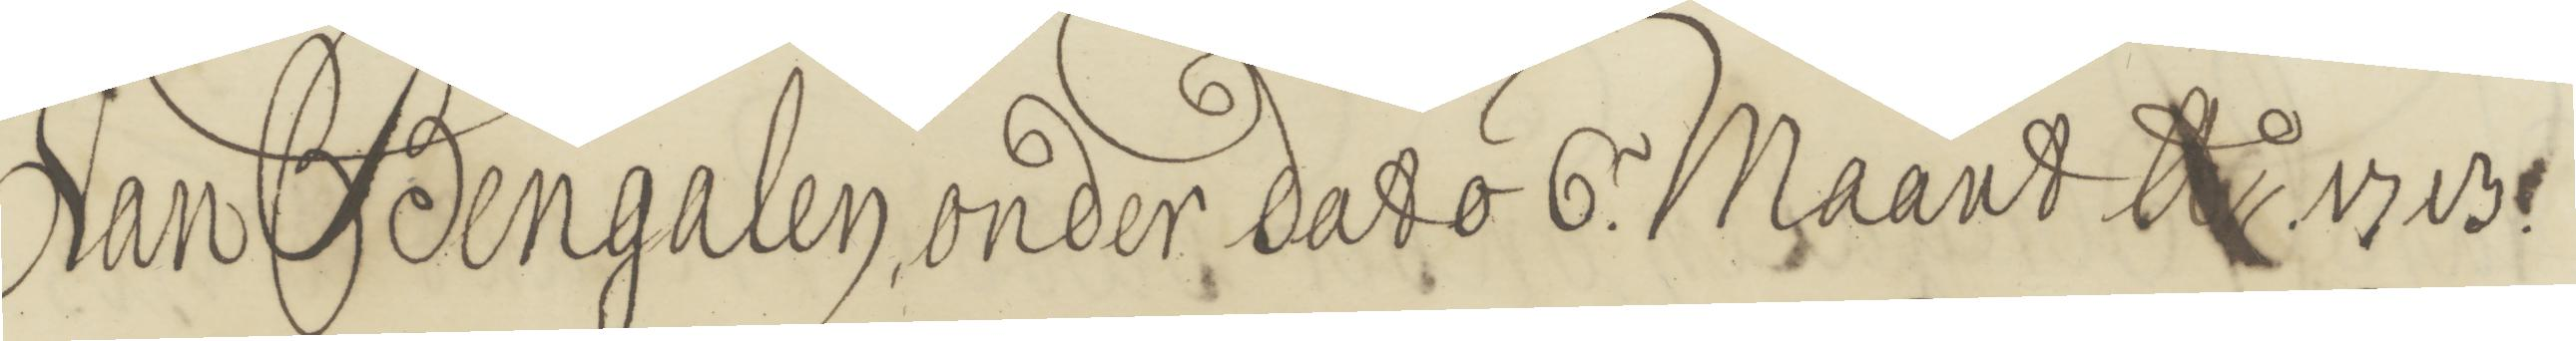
Van Bengalen, onder dato 6:' Maart A=o 1713.
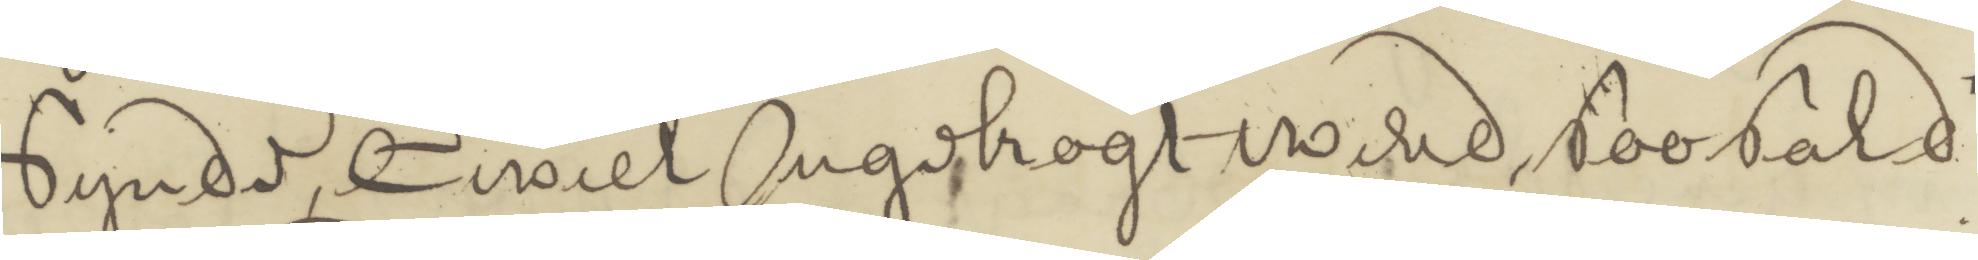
synde, Civiel Jngekogt werd, soo sal d'
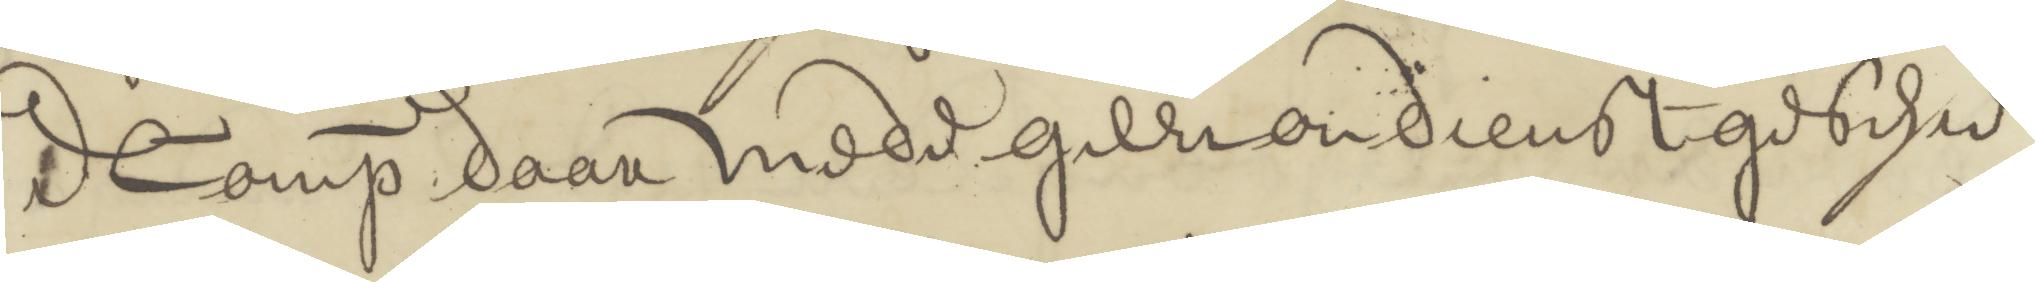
EComp: daar mede geen ondienst geschie
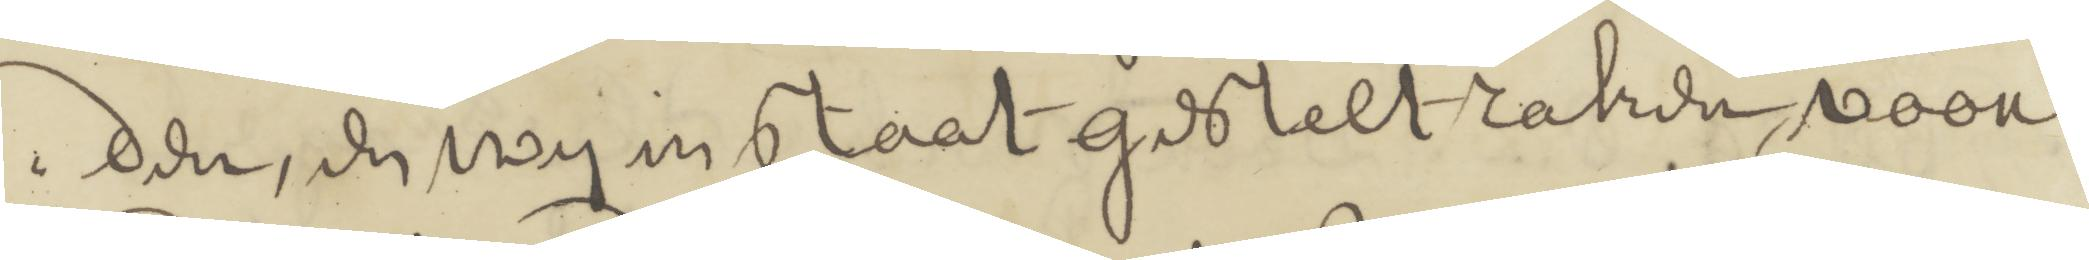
„den, en wy in staat gestelt raken, voor
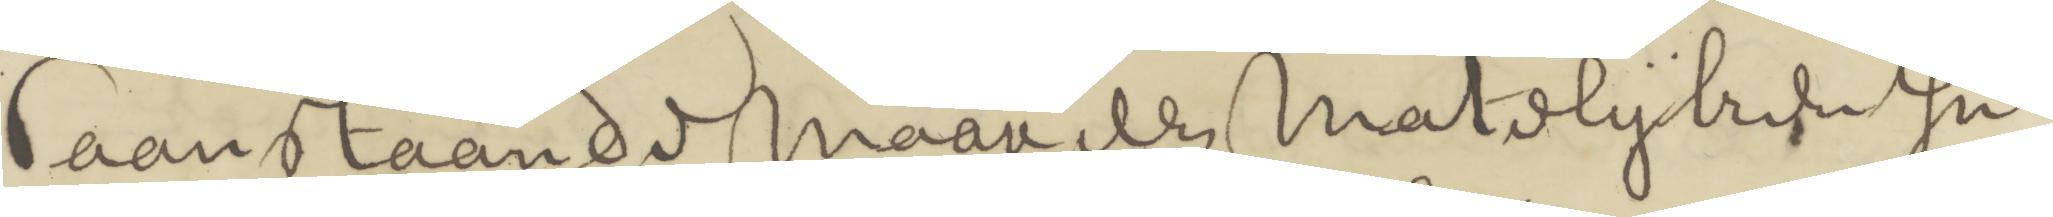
t aanstaande maar een matelijken Jn.
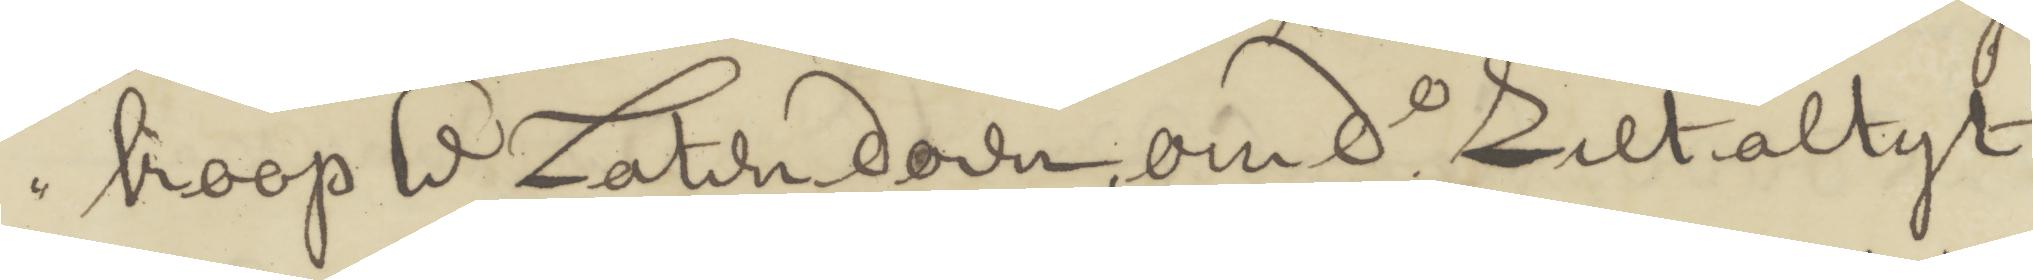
„koop te Laten doen, om d.o zilt altyt
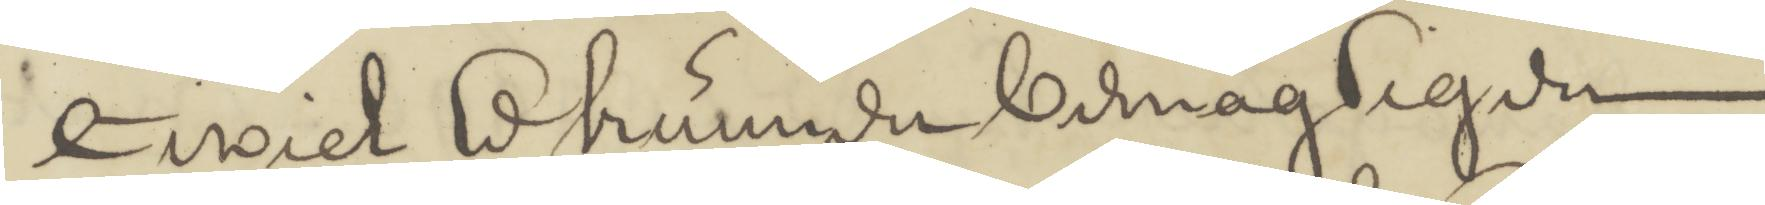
civiel te kunnen bemagtigen.
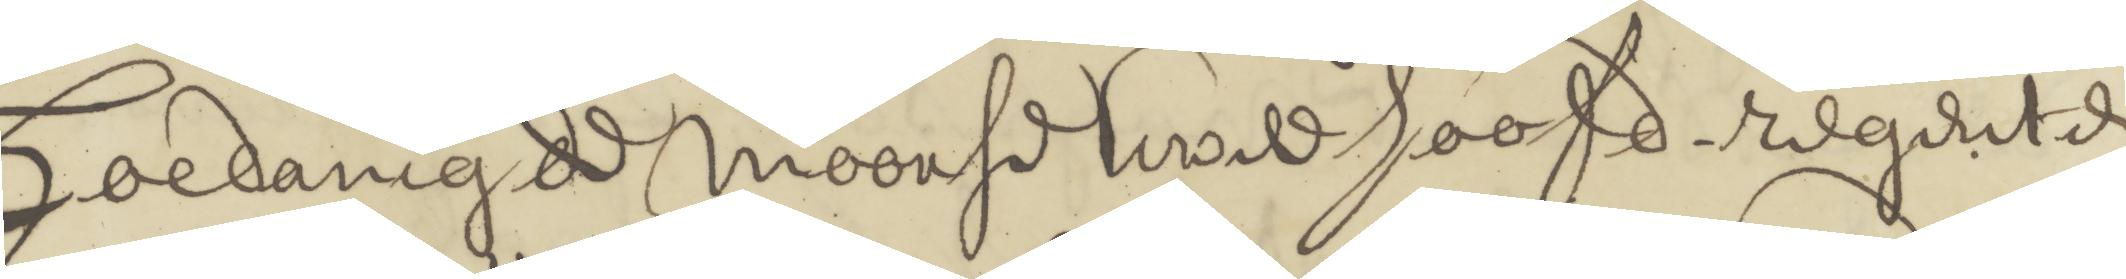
Hoedanig de moorse twee hoofd-regenten
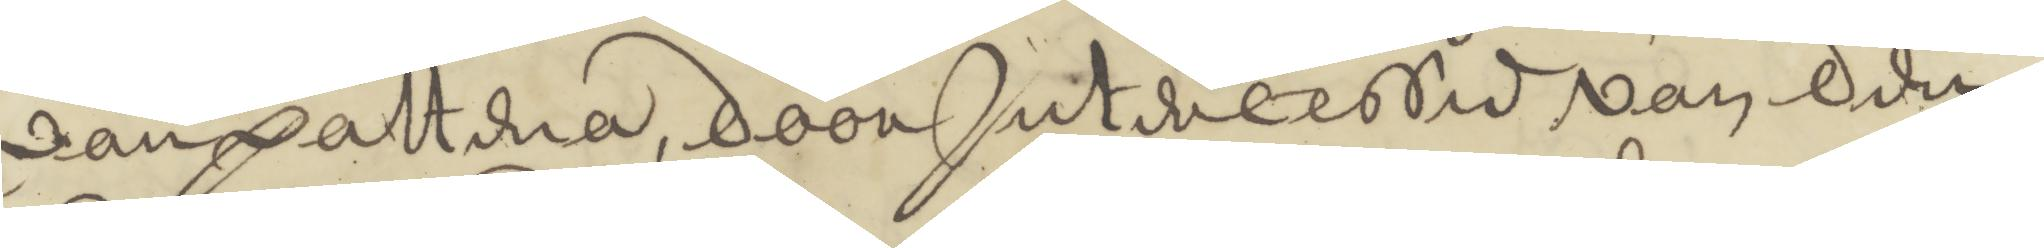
aan pattena, door Jntercessie van den
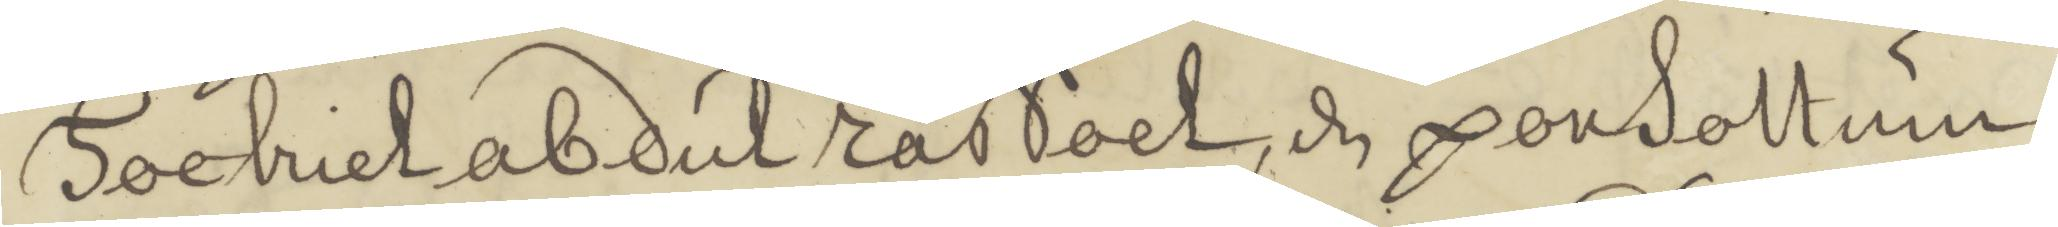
Hockiel abdul rassoel, en porsottum.
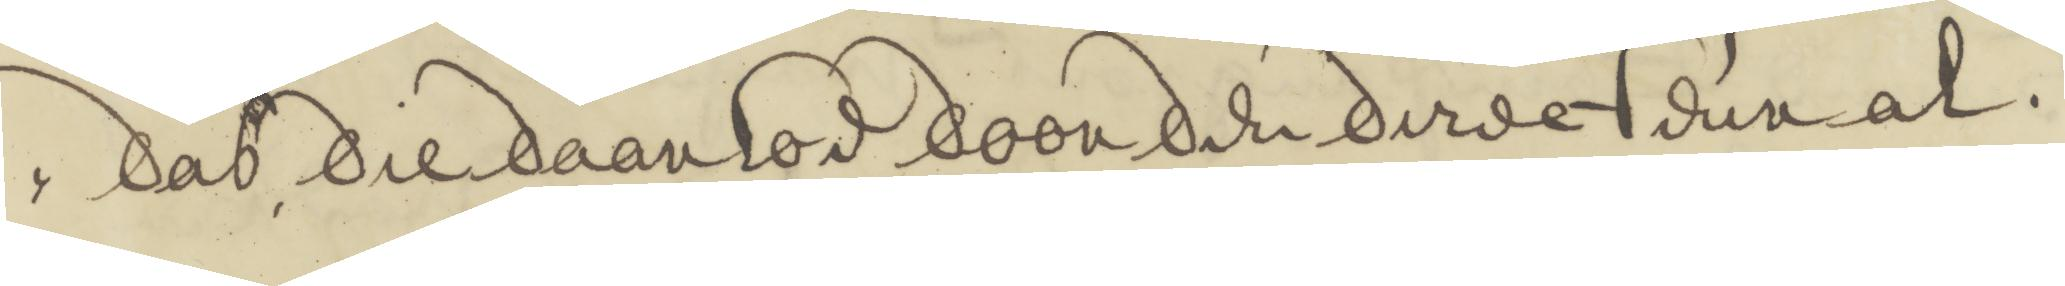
„bas, die daartoe door den directeur al.
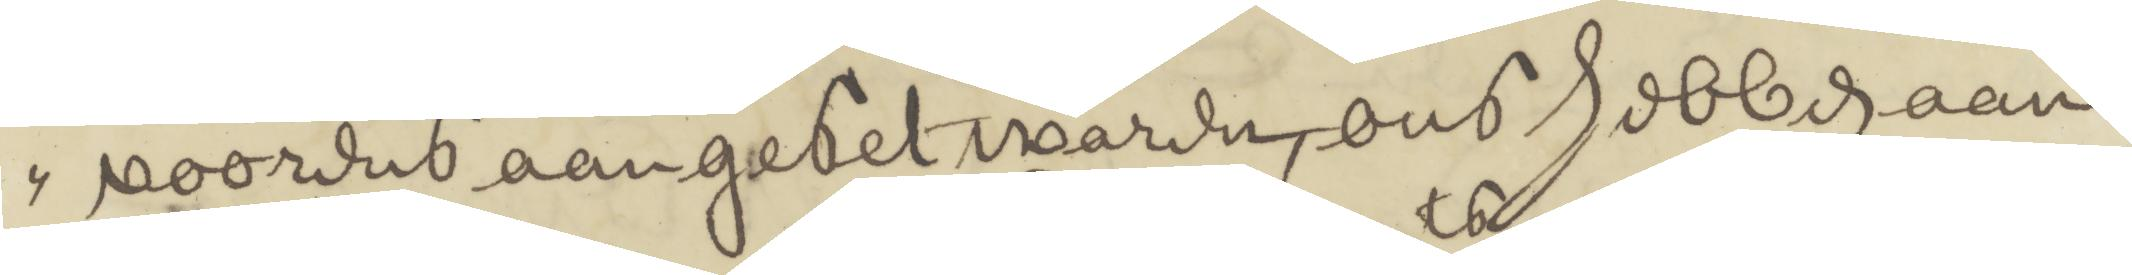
„voorens aangeset waren, ons hebben aan
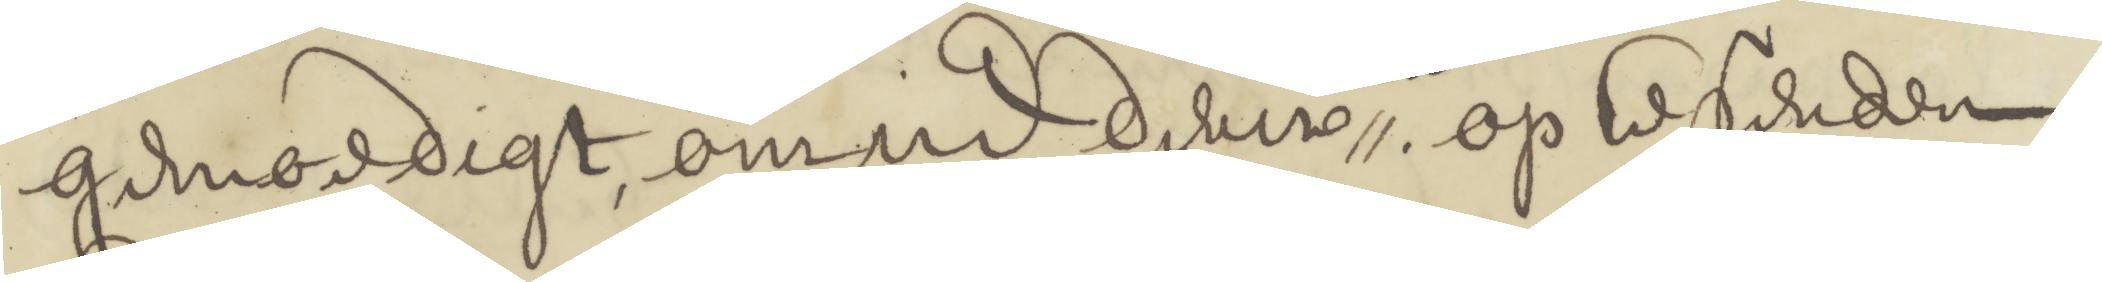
gemoedigt, om uE derw„.ts op te senden
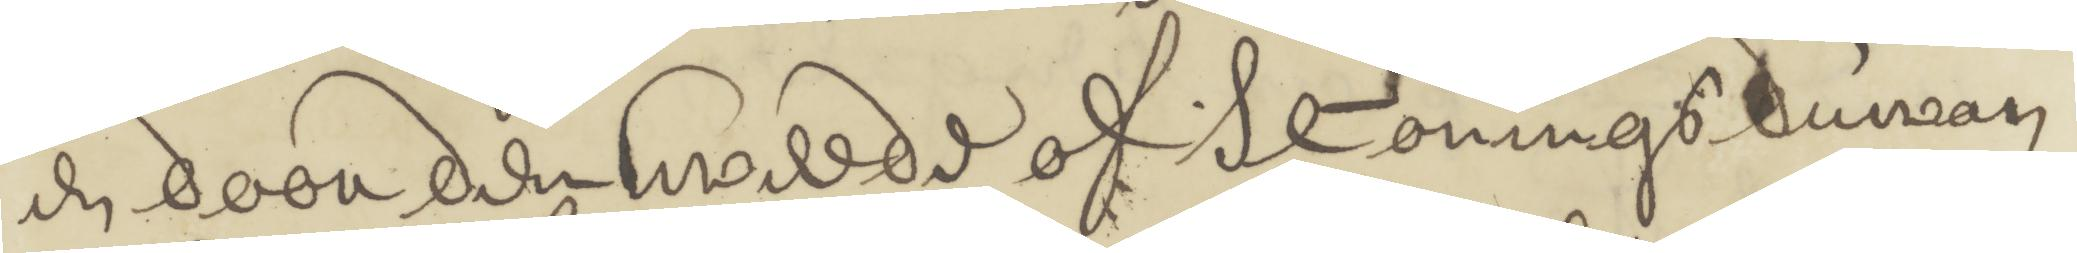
en door den tweede of 's Conings duwan
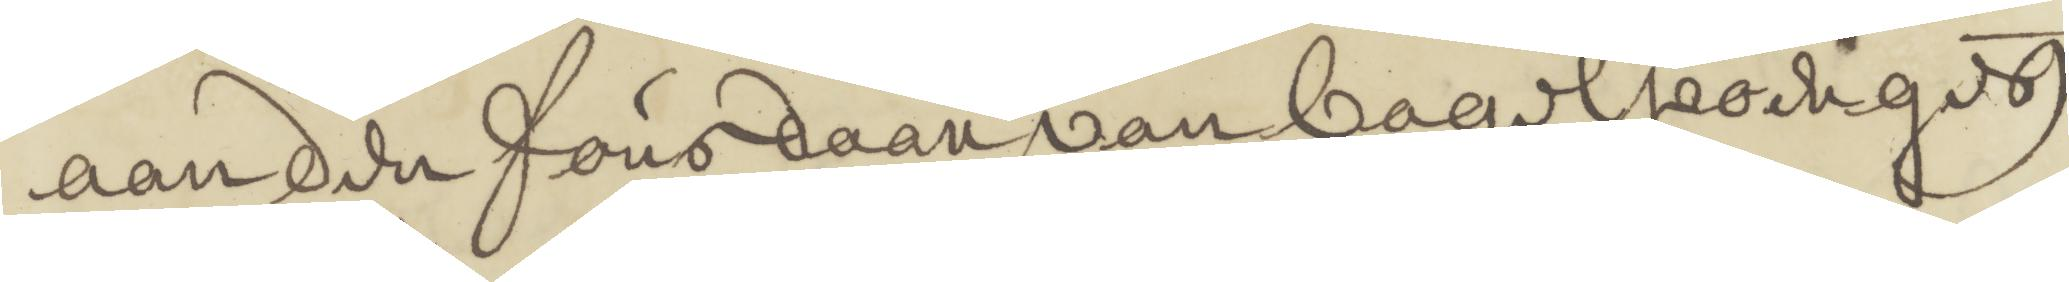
aan den fous daar van bagelpoer geb)
